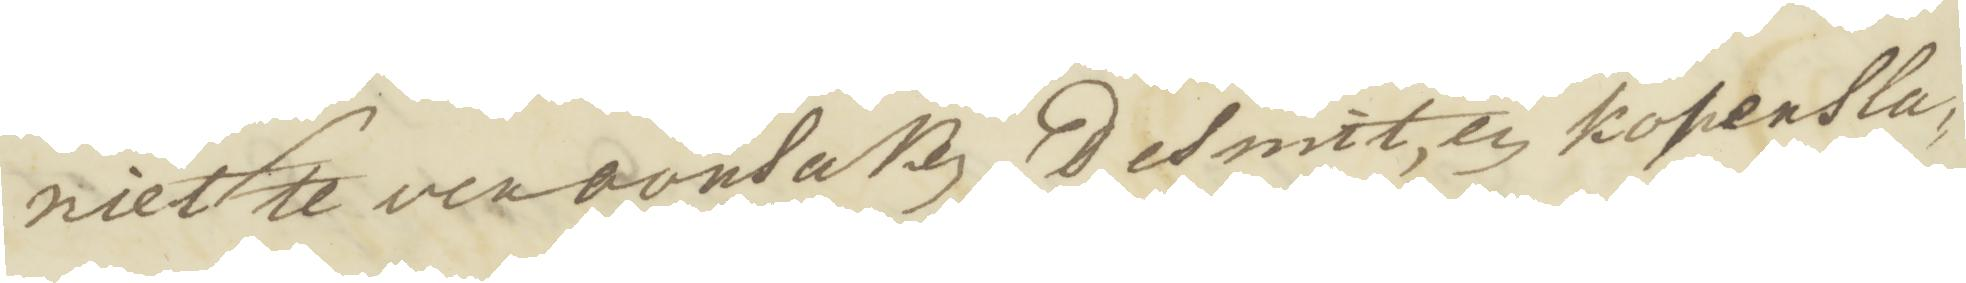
niet te veroorsaken desmit, en kopersla„
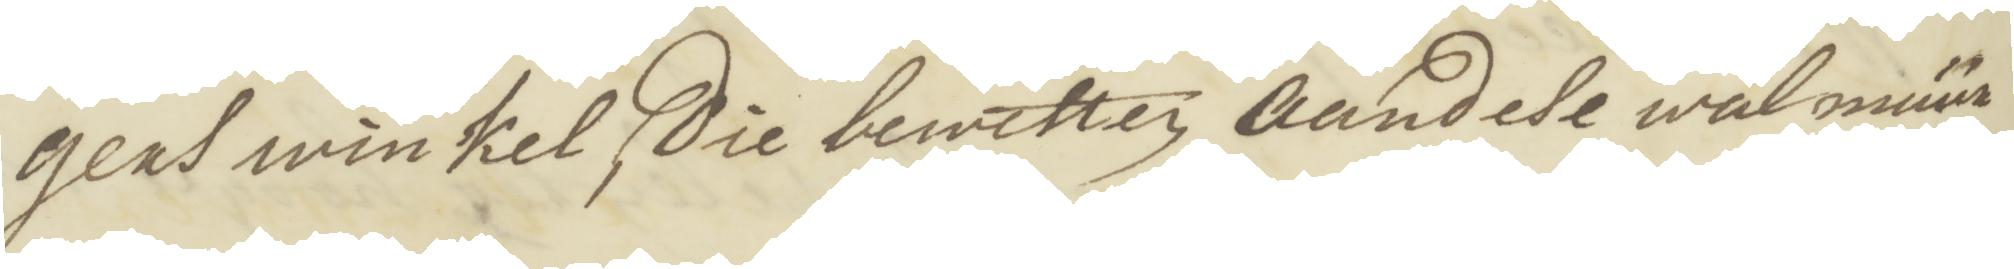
gers winkel, die bewesten aan dese wal muur
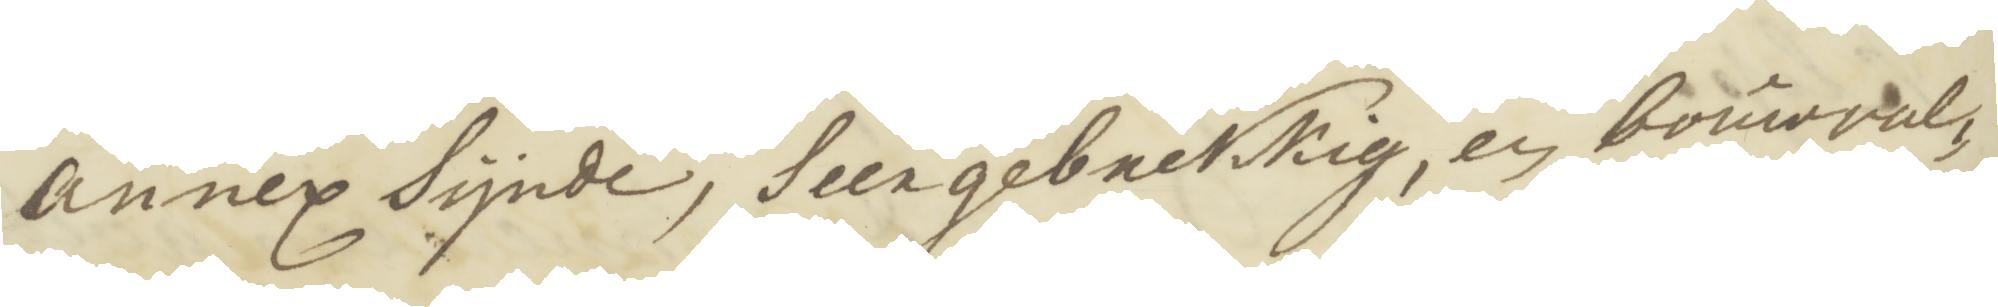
annex sijnde, seer gebrekkig, en bouwval„
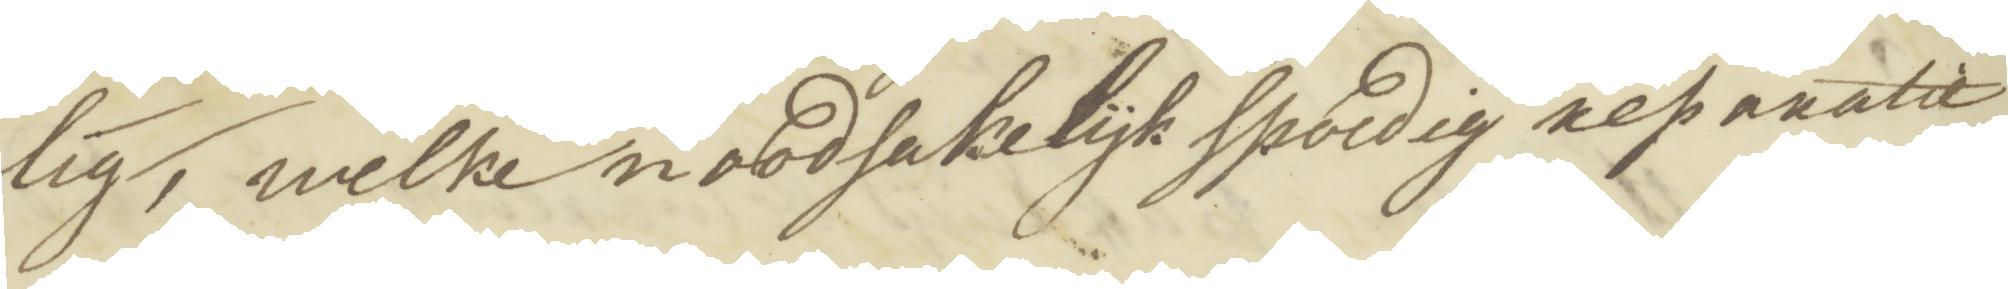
lig, welke noodsakelijk spoedig reparatie
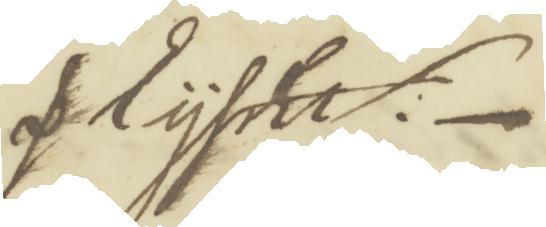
verEijscht: —
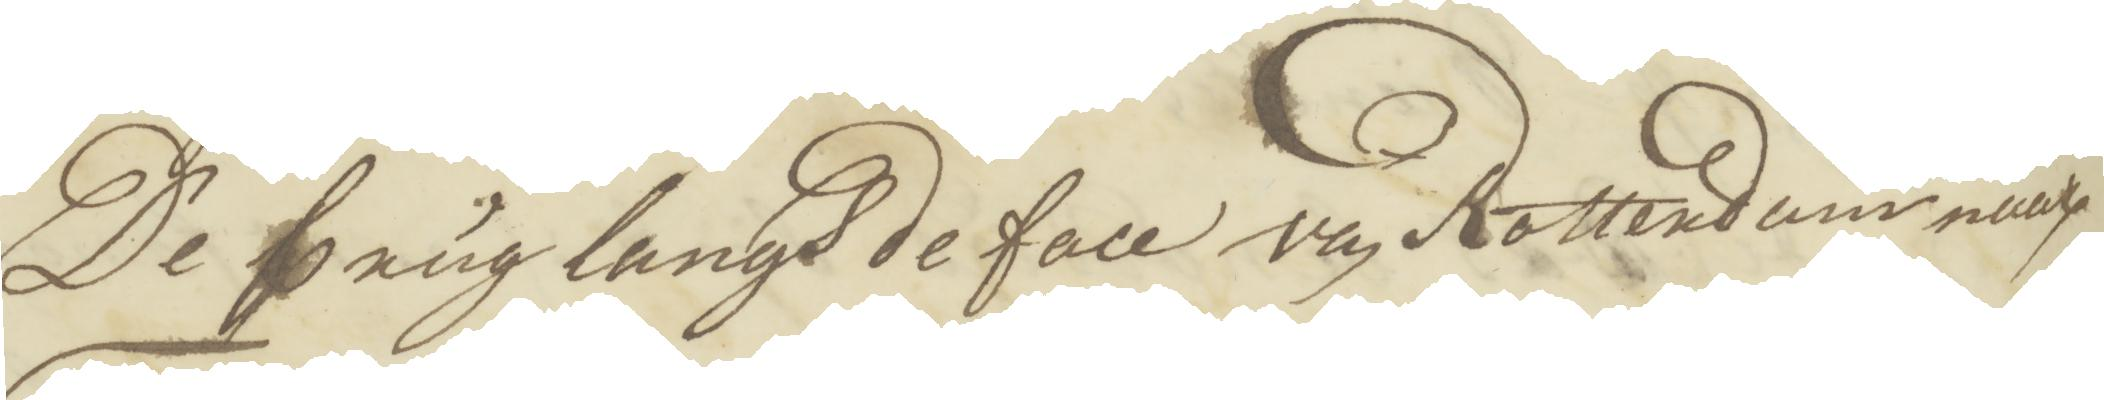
De brug langs de face van Rotterdam naar
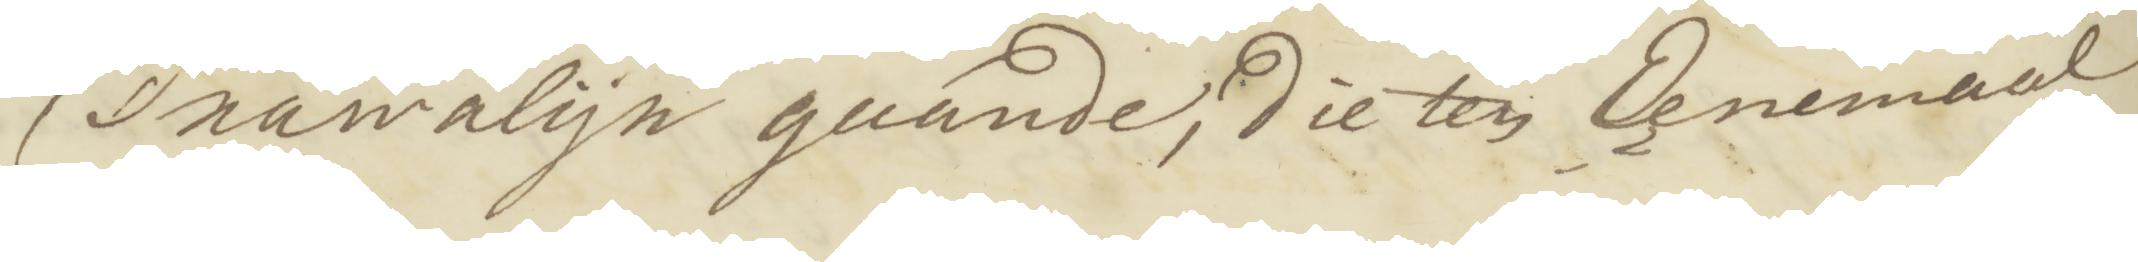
Trawalijn gaande, die ten Eenemaal
